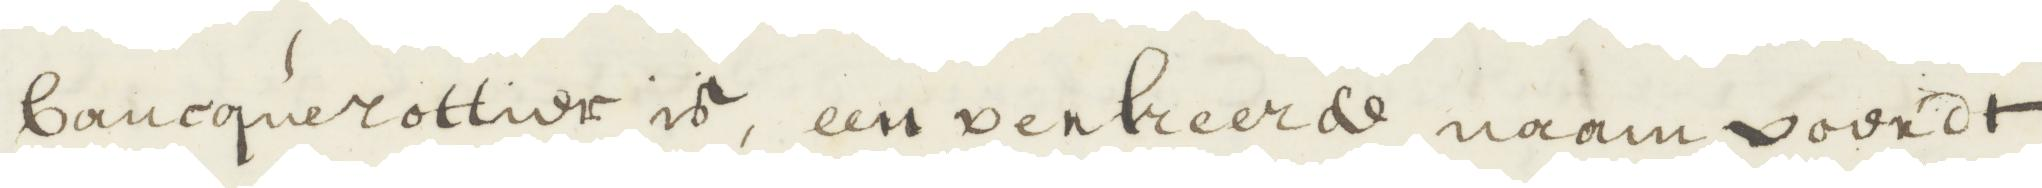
bancquerottier is, een verkeerde naam voerdt
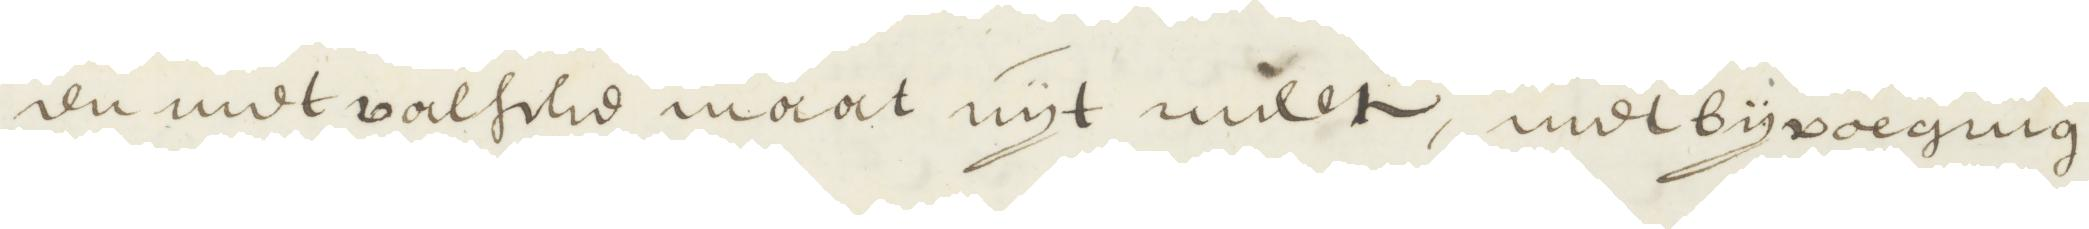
en met valsche maat uijt meet, met bijvoeging
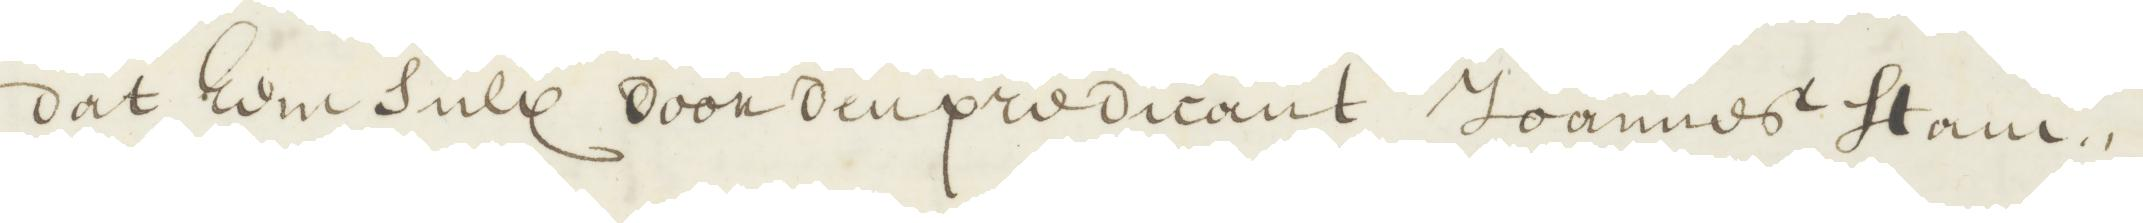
dat hem sulx door den predicant Ioannes stam„
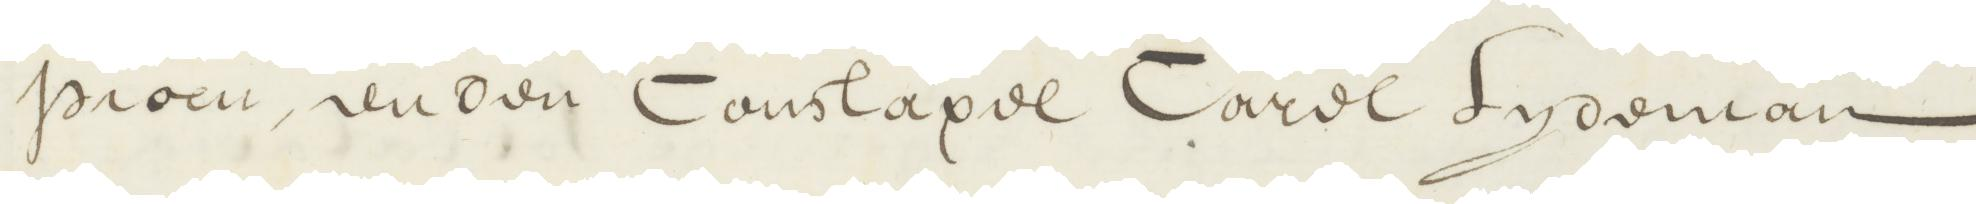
pioen, en den Constapel Carel tydeman
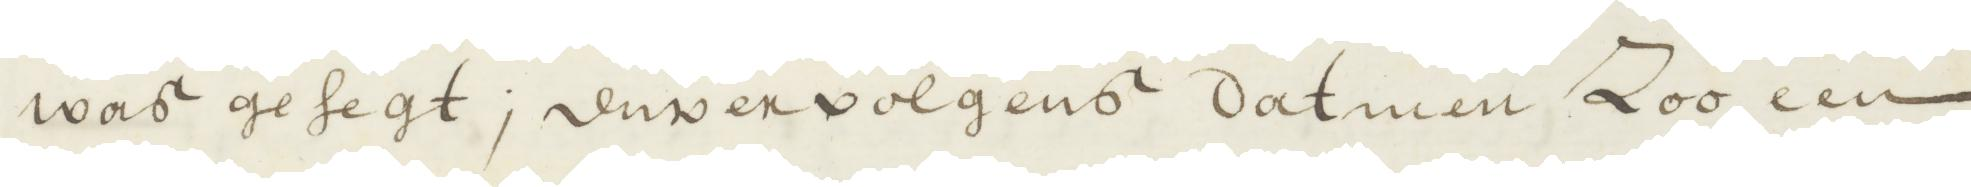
was gesegt; envervolgens dat men zoo een
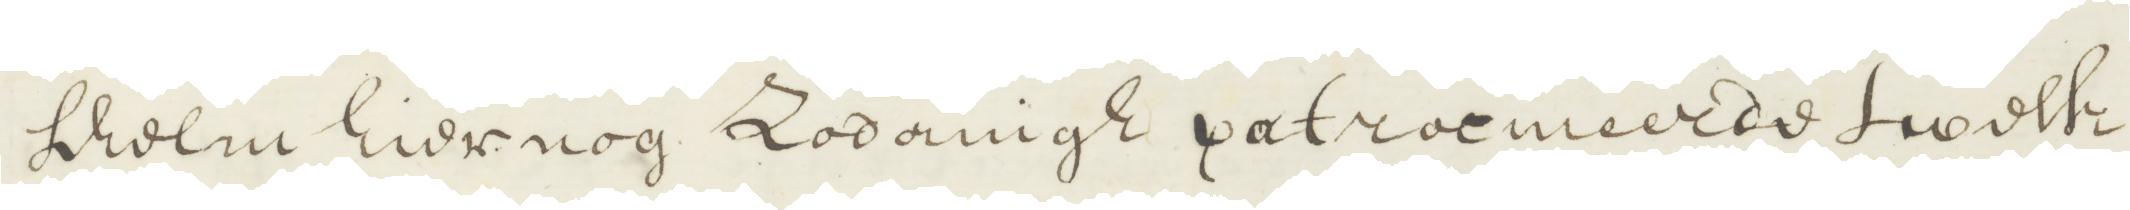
schelm hier nog zodanigh patroineerde, 'twelk
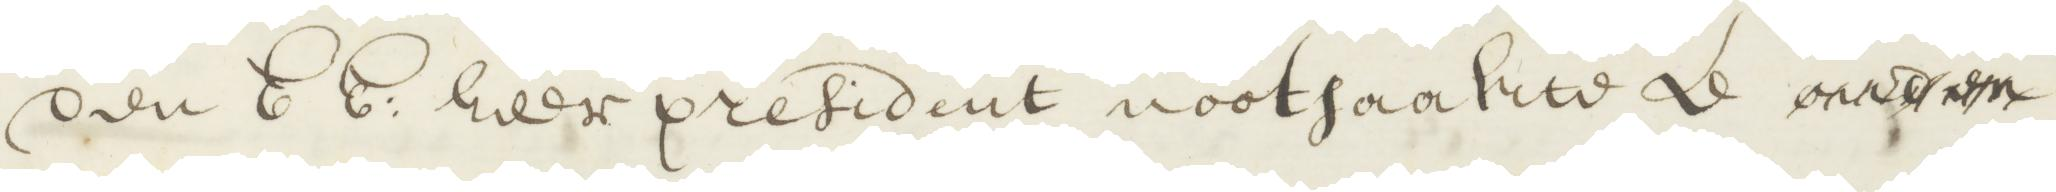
den E E: heer president nootsaakte te orderen
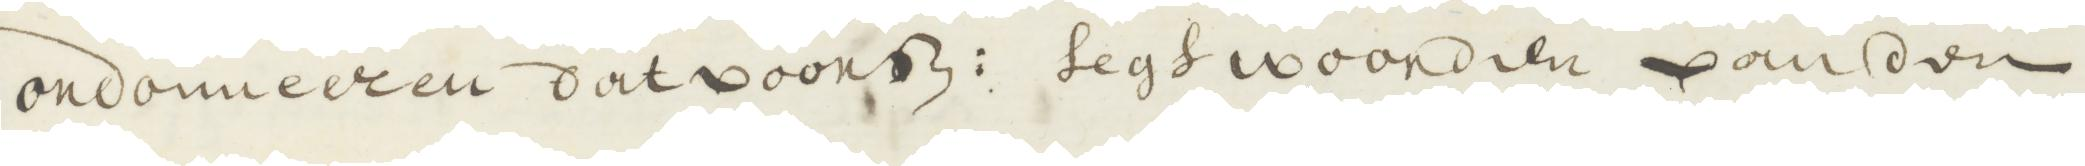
ordonneeren dat voors: seghwoorden van den
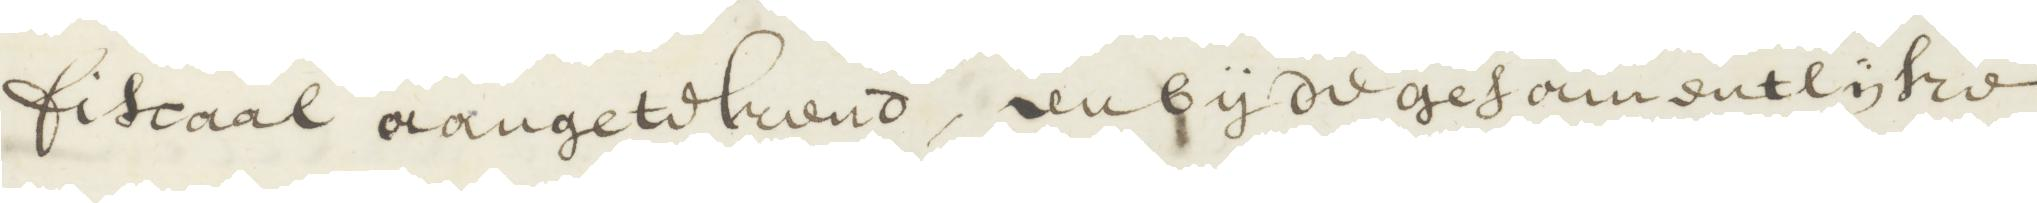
fiscaal aangetekend, en bij de gesamentlijke
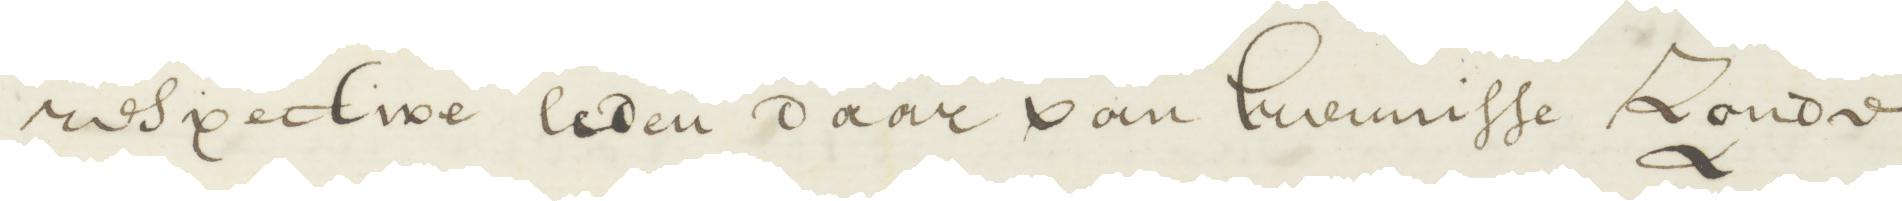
respective leden daar van kennisse zoude
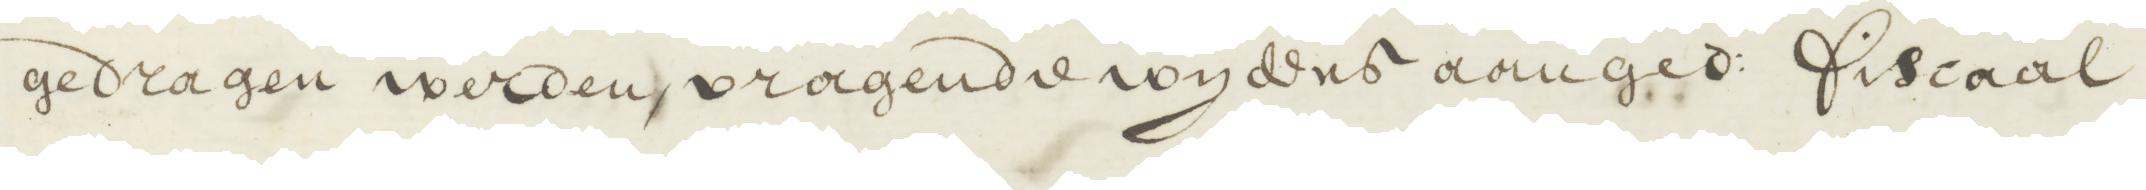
gedragen werden, vragende wijders aan ged: fiscaal,
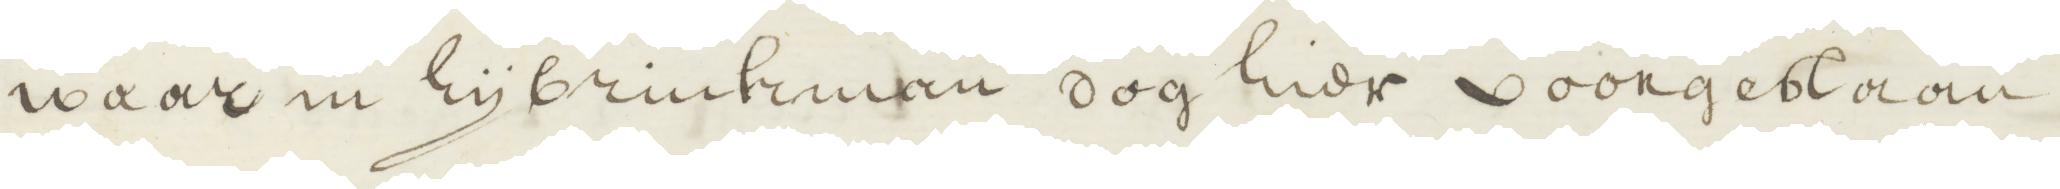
waar in hij brinkman dog hier voorgestaan
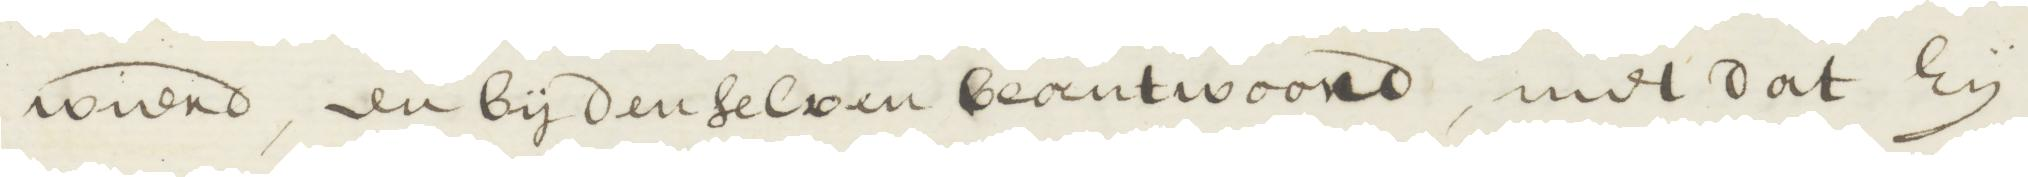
wierd, en bij denselven beantwoord, met dat hij
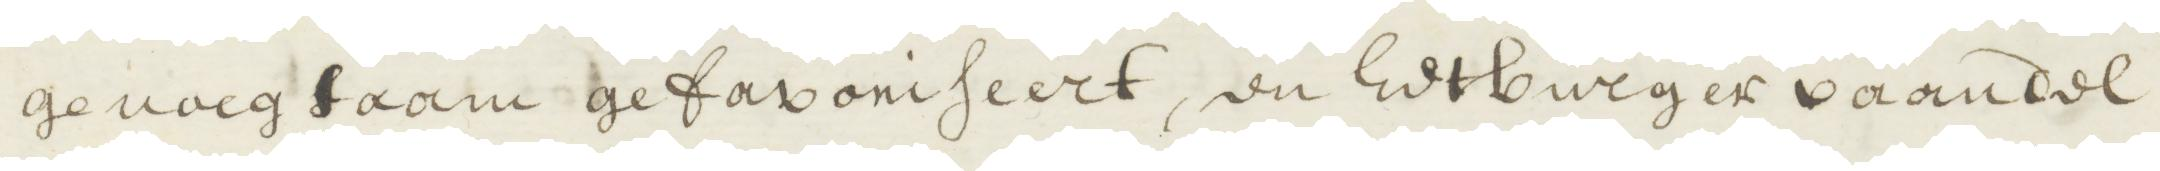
genoegsaam gefavoriseert, en het burger vaandel
